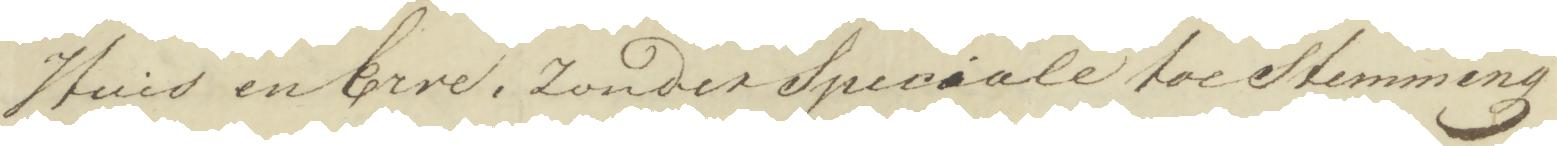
Huis en Erve, zonder speciale toestemming
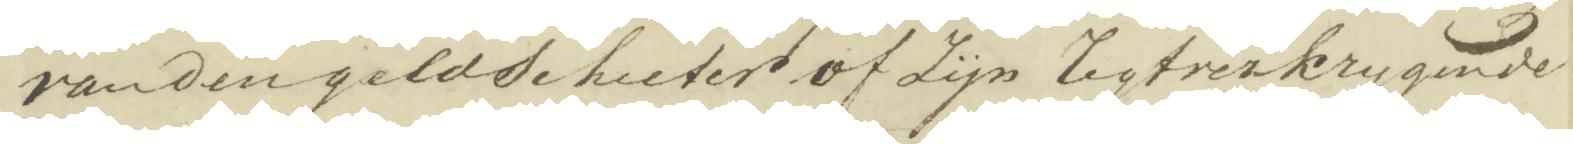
van den geldschieter of Zijn regtverkrygende
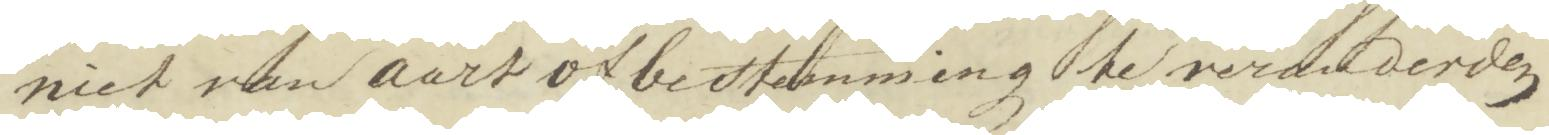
niet van aart of bestemming te veranderden
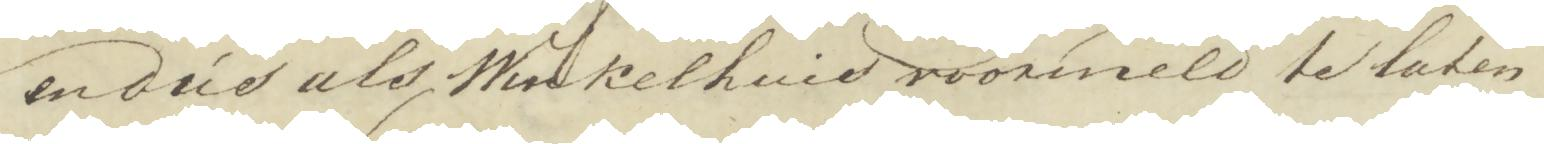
en dus als Winkelhuis voormeld te laten
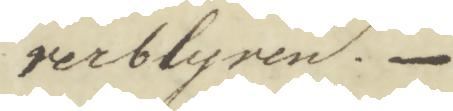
verblyven.—
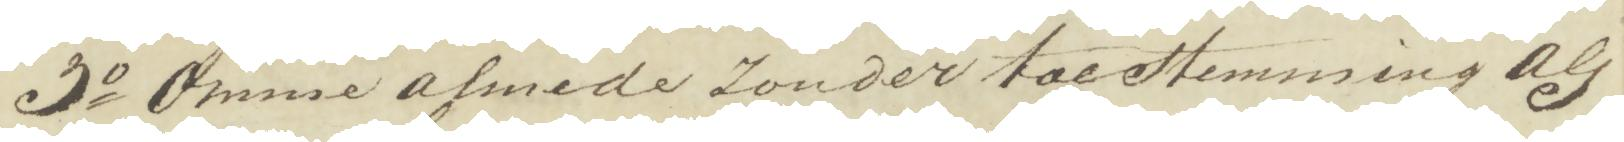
3=o Omme almede zonder toestemming als
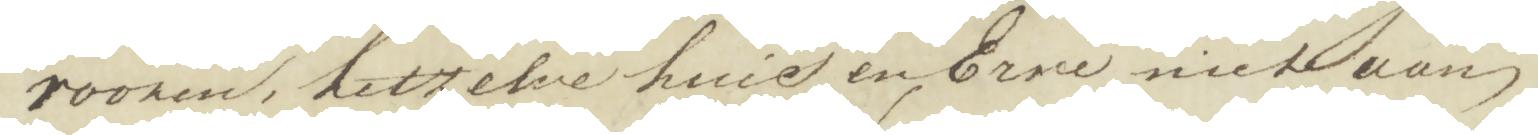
vooren, hetzelve huis en Erve niet aan
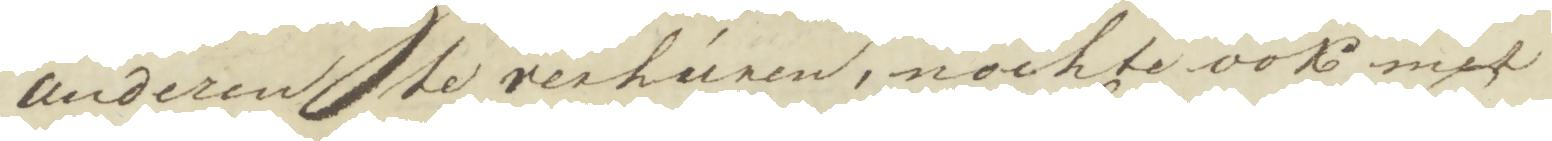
anderen te verhuren, nochte ook met
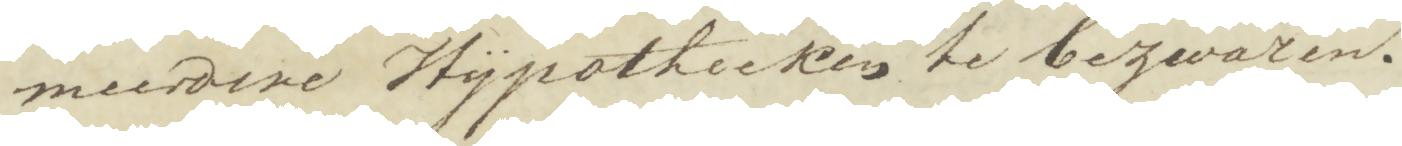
meerdere Hijpotheeken te bezwaren.
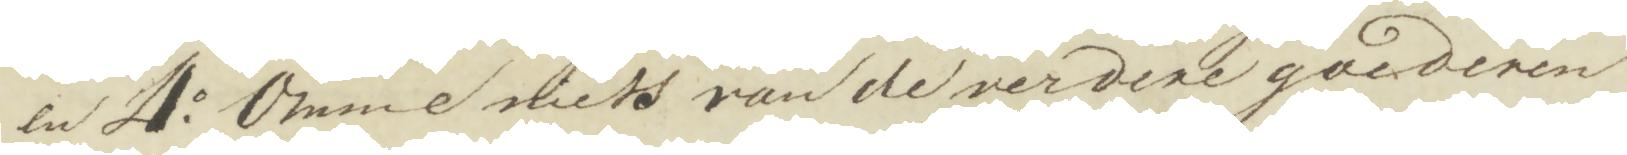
en 4.o Omme niets van de verdere goederen
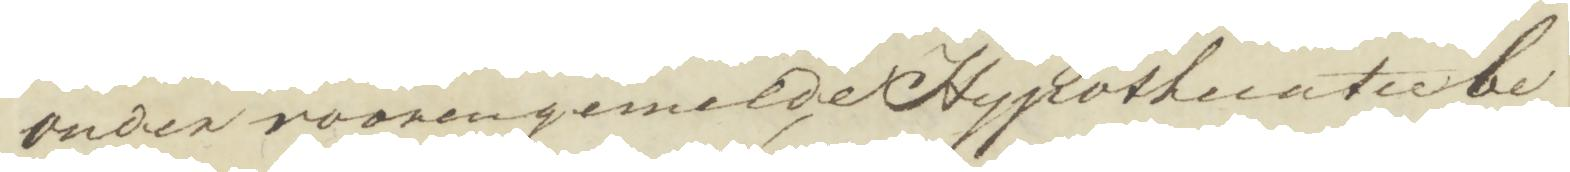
onder voorengemelde Hypothecatie be
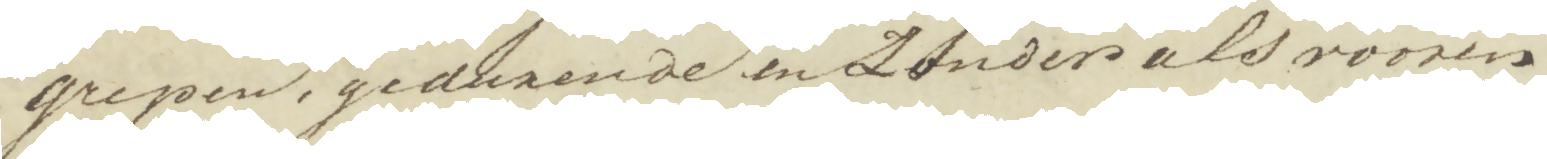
grepen, gedurende en Zonder als vooren
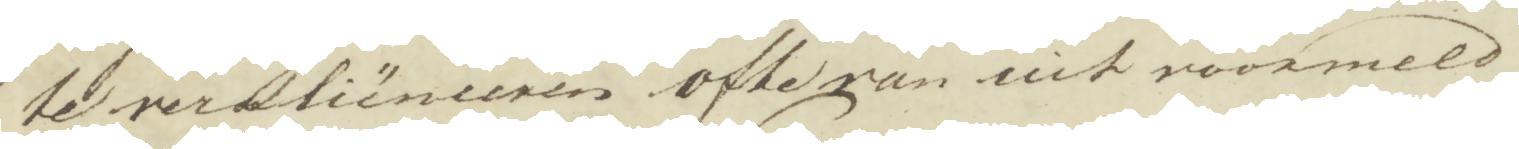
te vereliëneeren ofte van uit voormeld
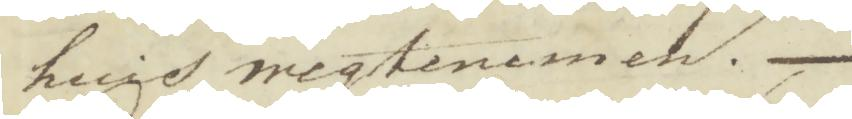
huis wegtenemen. —
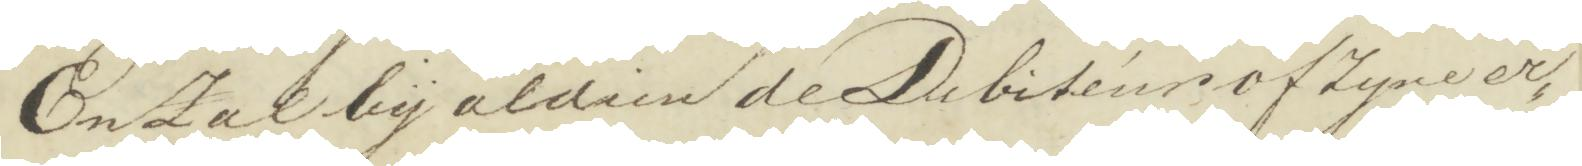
En Zal bij aldien de Debiteur of Zyne er„
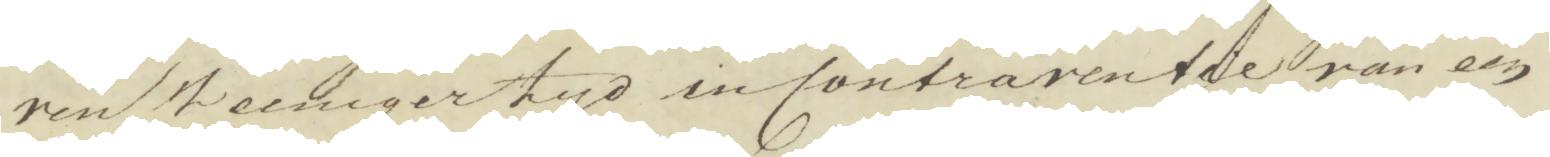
ven ’t eeniger tyd in Contraventie van een
